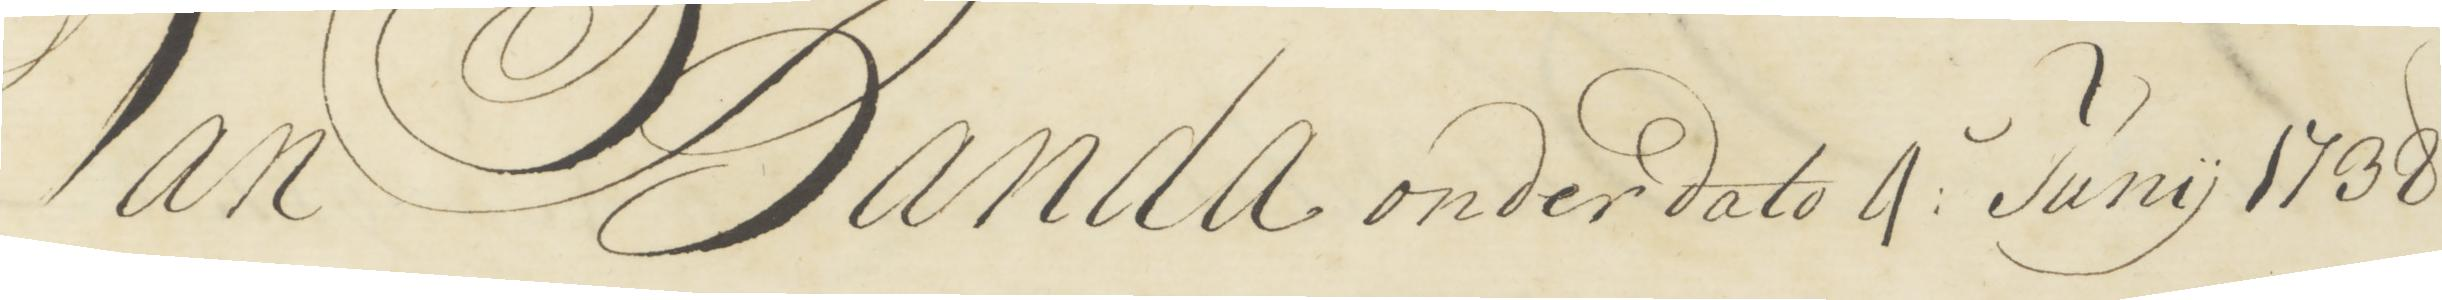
Van Banda onder dato 4:' Iunij 1738
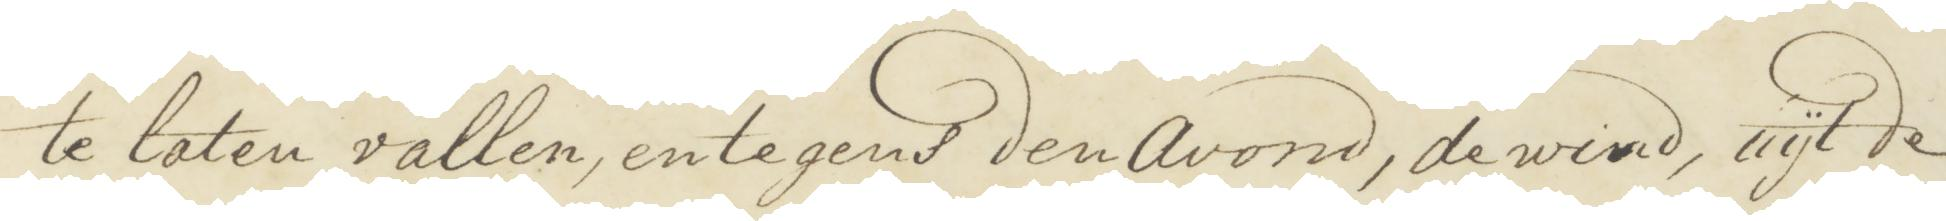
te laten vallen, en tegens den Avond, de wind, uijt de
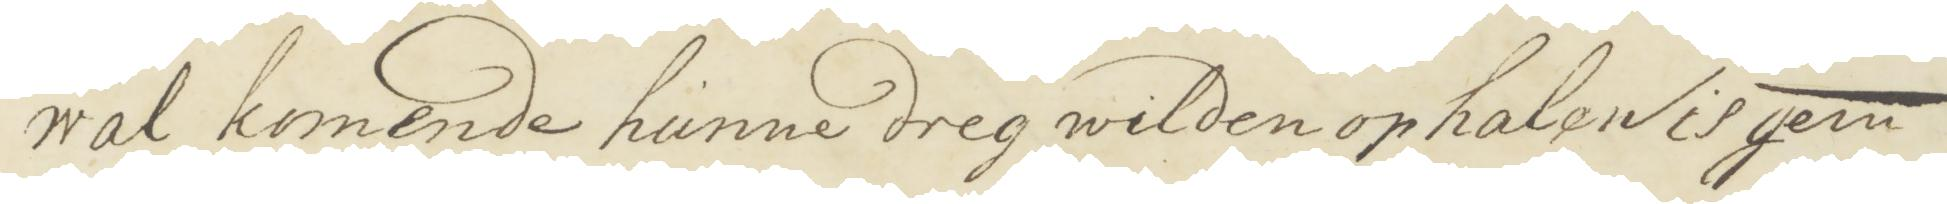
wal komende hunne dreg wilden op halen is gem
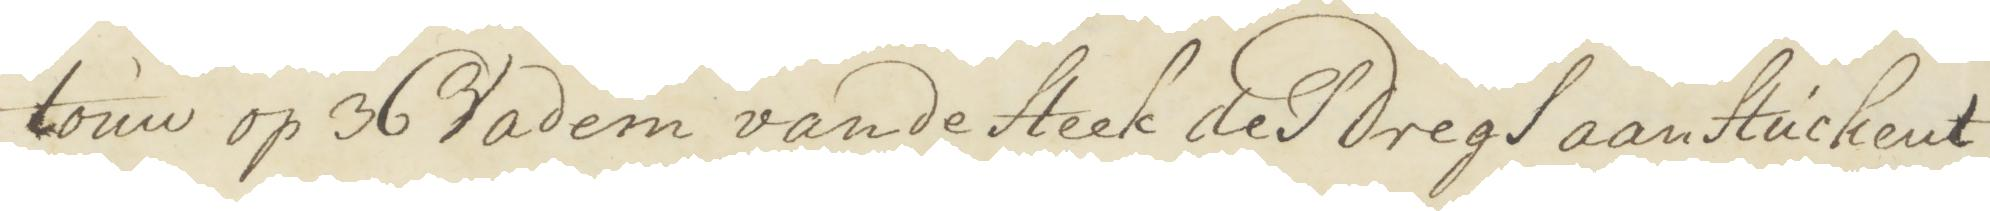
touw op 36 Vadem van de steek des dregs aanstuckent
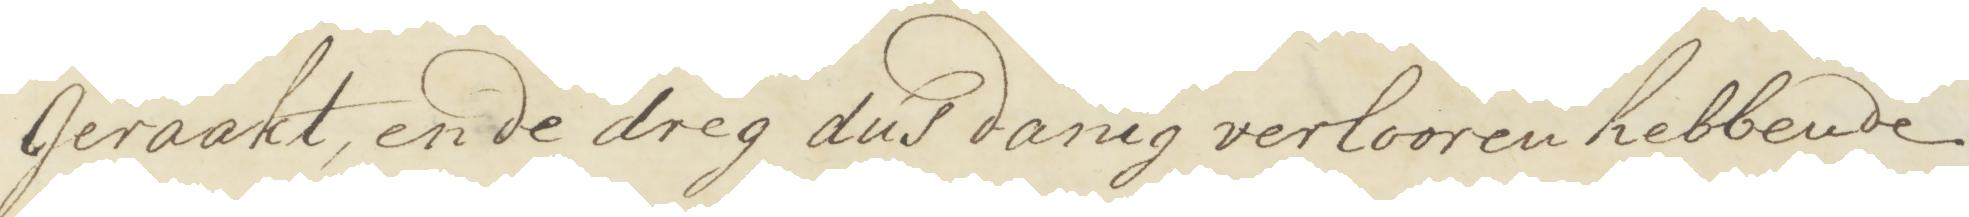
Geraakt, en de dreg dus danig verlooren hebbende
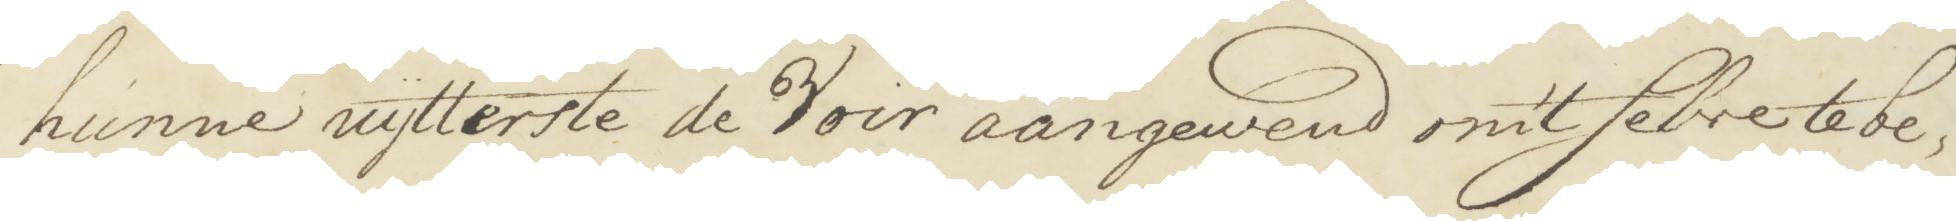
hunne uijtterste de Voir aangewend om ’t selve te be„
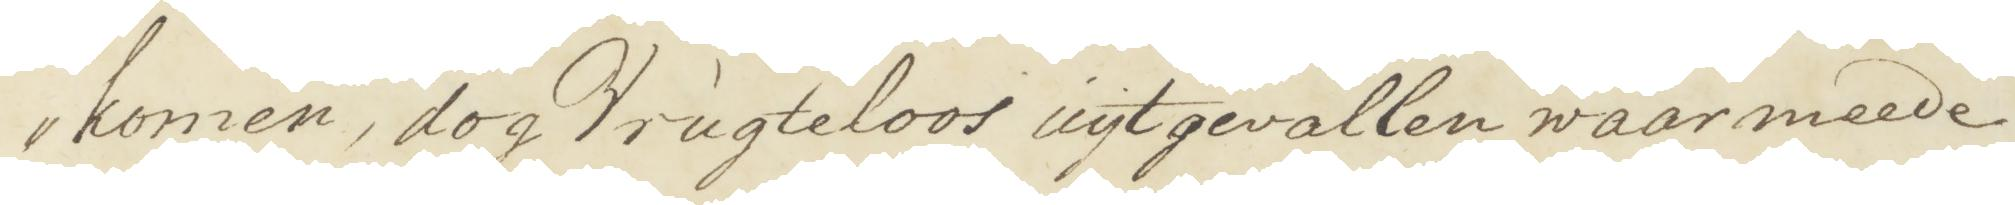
„komen, dog Vrugteloos uijtgevallen waar meede
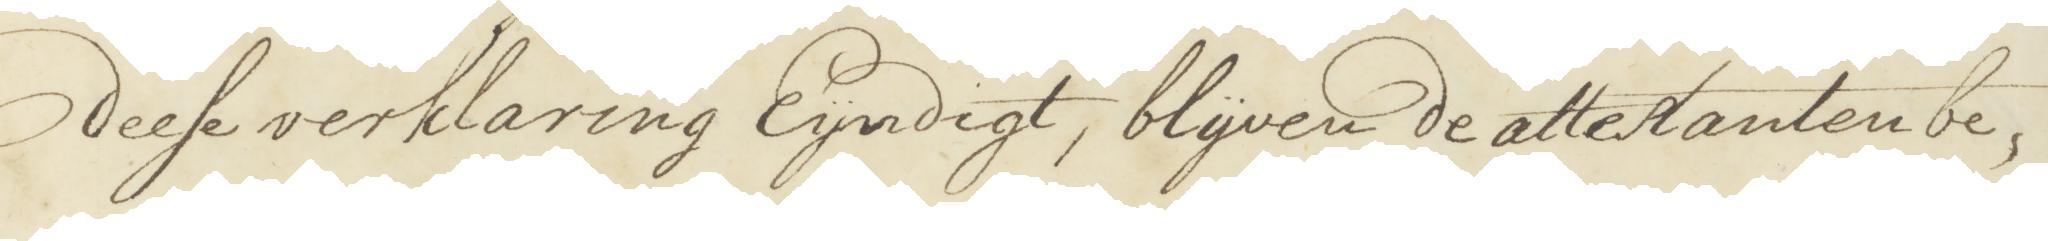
deese verklaring Eijndigt, blijven de attestanten be„
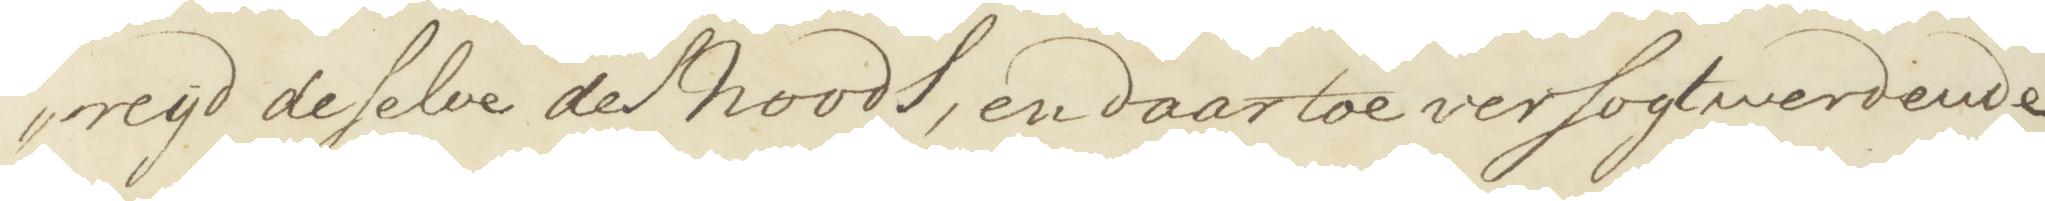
„reijd deselve des Noods, en daar toe versogt werdende
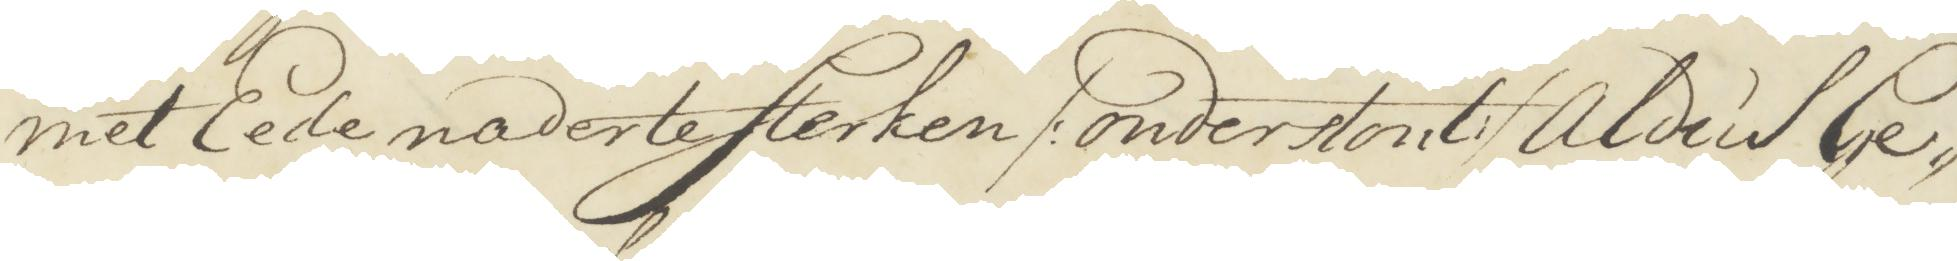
met Eede nader te Sterken /:onderstont:/ Aldus Ge„
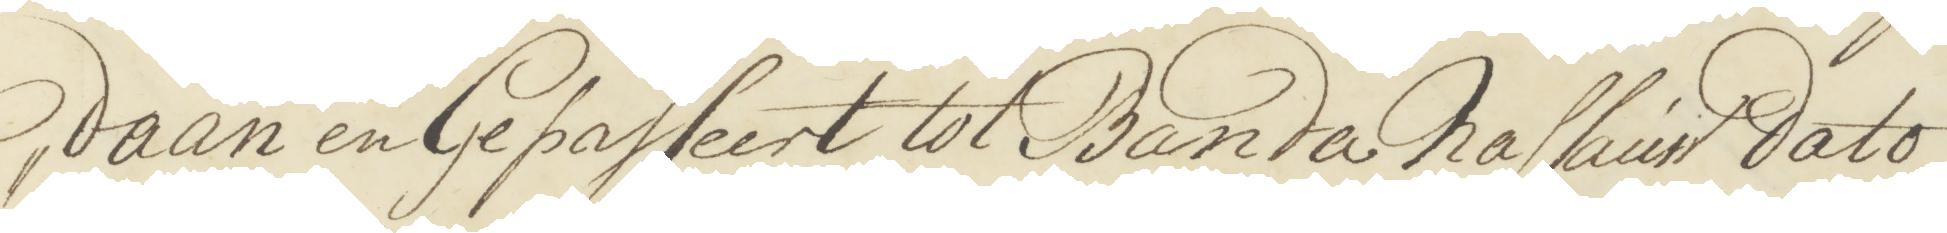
„daan en Gepasseert tot Banda Nassauw dato
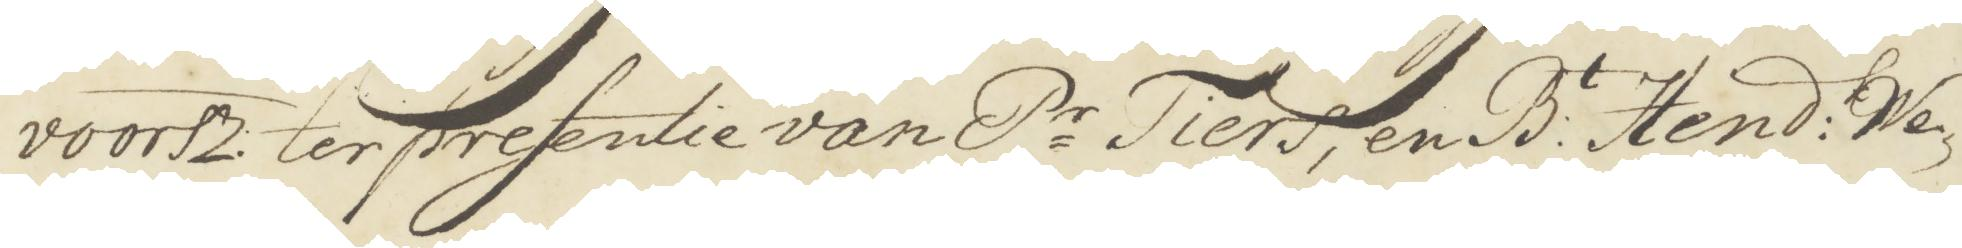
voorsz: ter presentie van P=r Tiers, en B:t Hend:k We
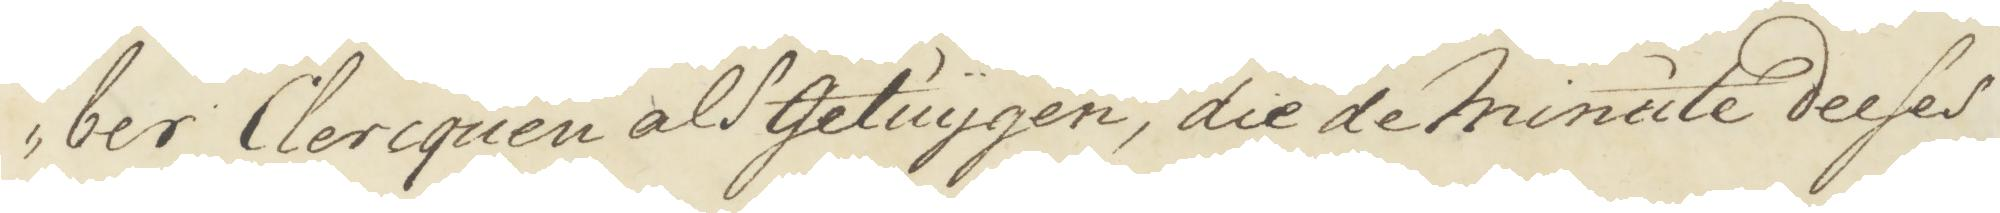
„ber Clercquen als Getuijgen, die de Minute deeses
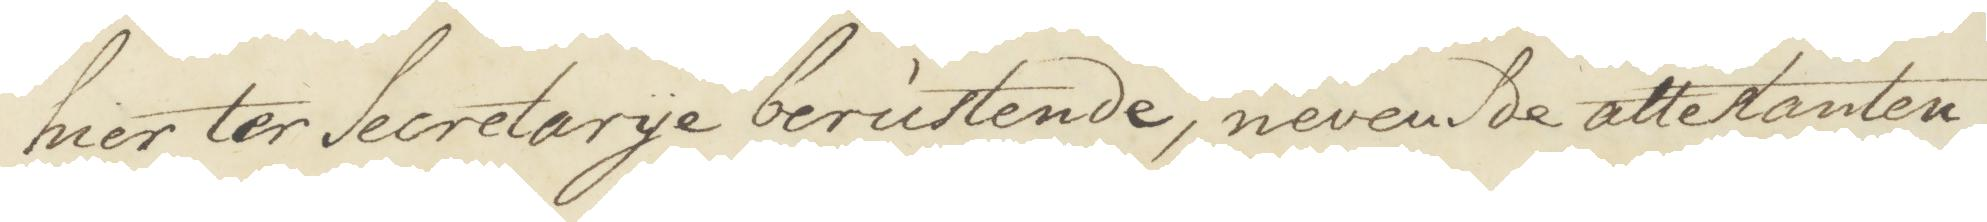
hier ter secretarije berustende, nevens de attestanten
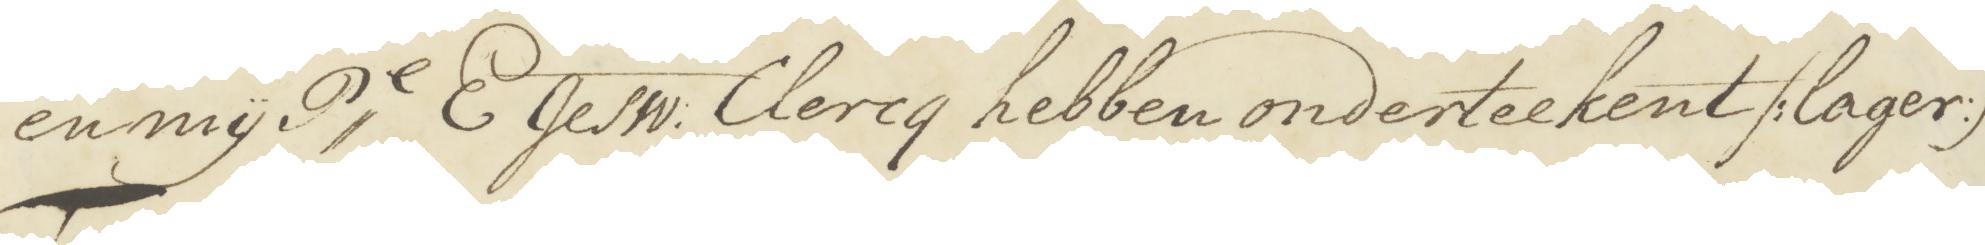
en mij P„l E gesw: Clercq hebben onderteekent /:lager:)
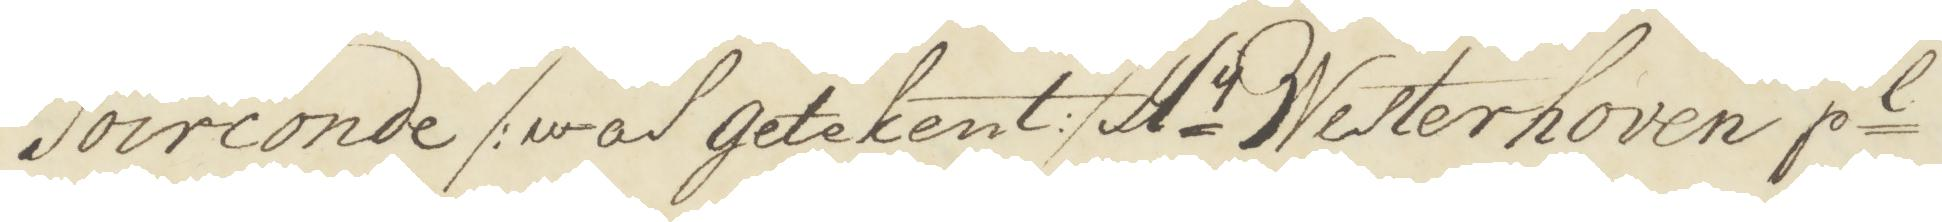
Toirconde /:was getekent:/ M=r Westerhoven p=l
